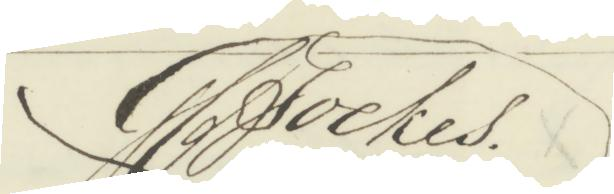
GCJoekes.
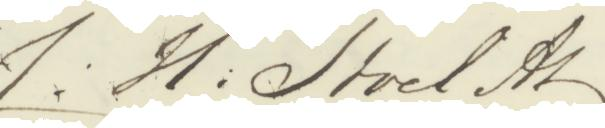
J: H: Stoel Az
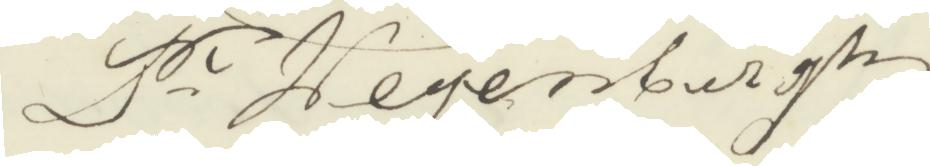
P.r Weyenburgh
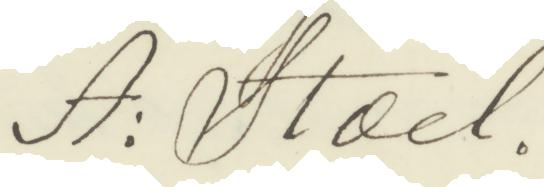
A: Stoel
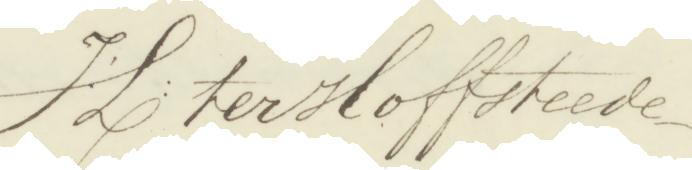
J: L: ter Hoffsteede
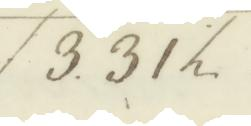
ƒ 3.31½.
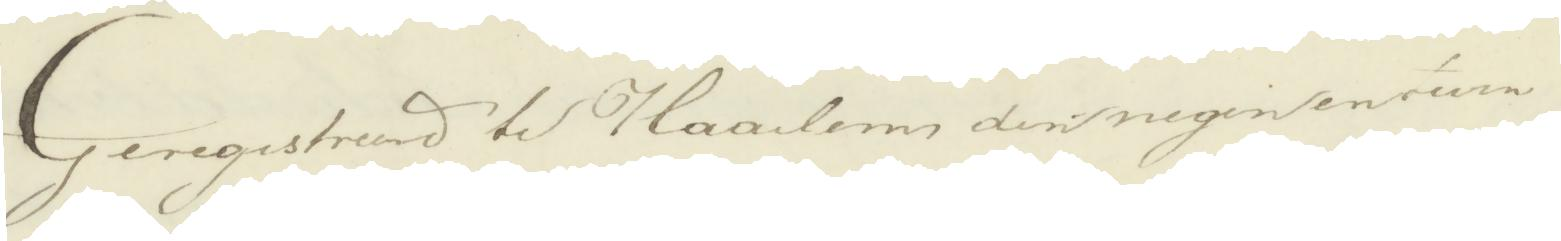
Geregistreerd te Haarlem den negen en twin
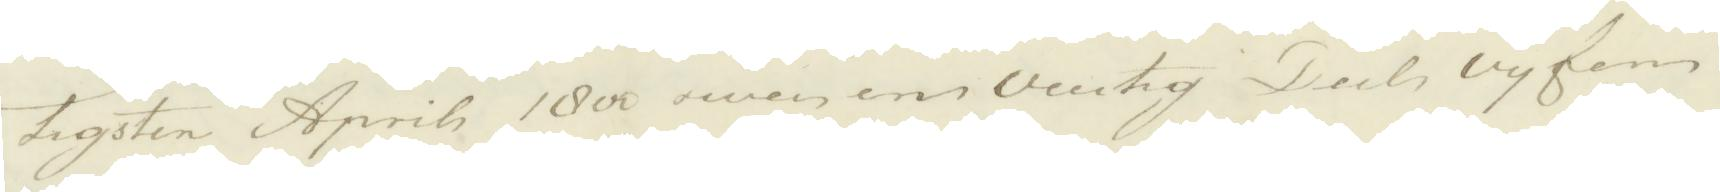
tigsten April 1800 Zeven en veertig Deel vyfen
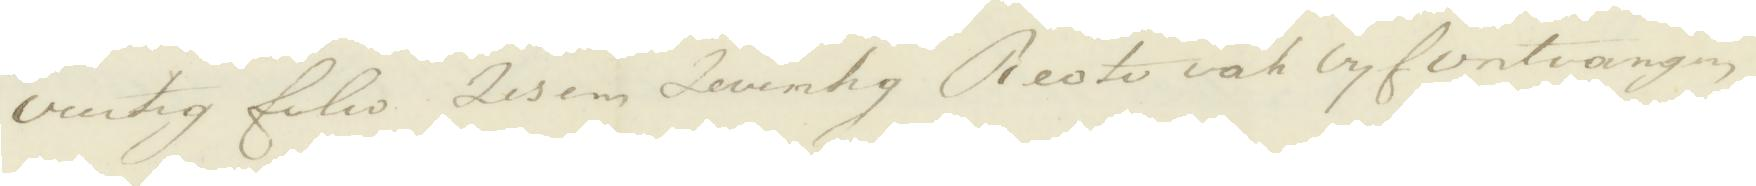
veertig folio Zes en zeventig Recto vak vyf ontvangen
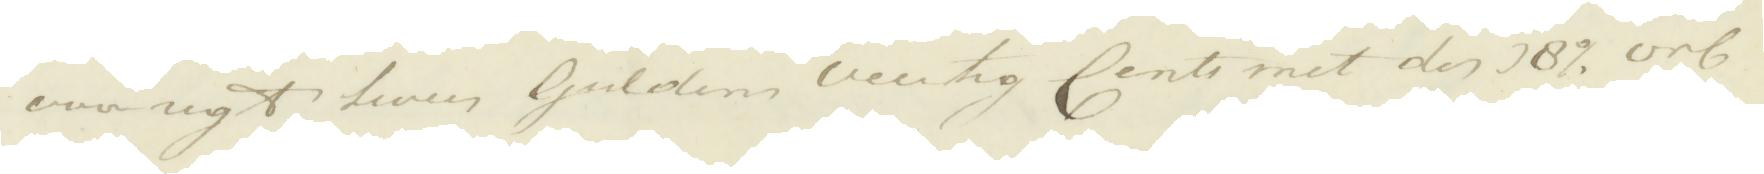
voor regt twee guldens veertig Cents met den 38%. opC
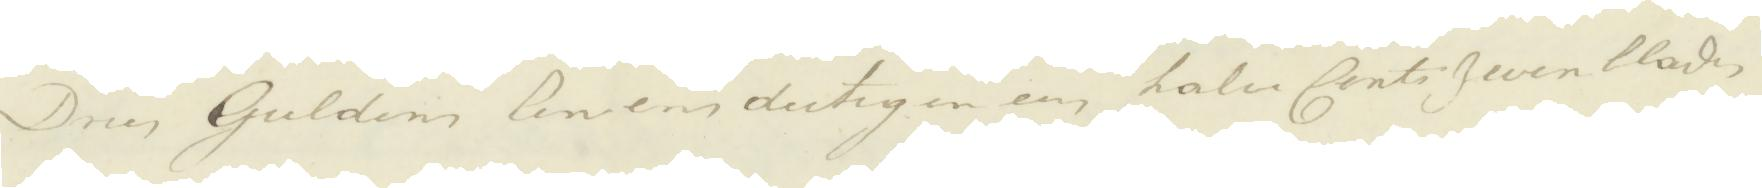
Drie Guldens Een en dertig en een halve Cents Zeven bladen
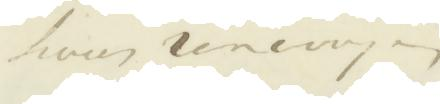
twee renvooyen
